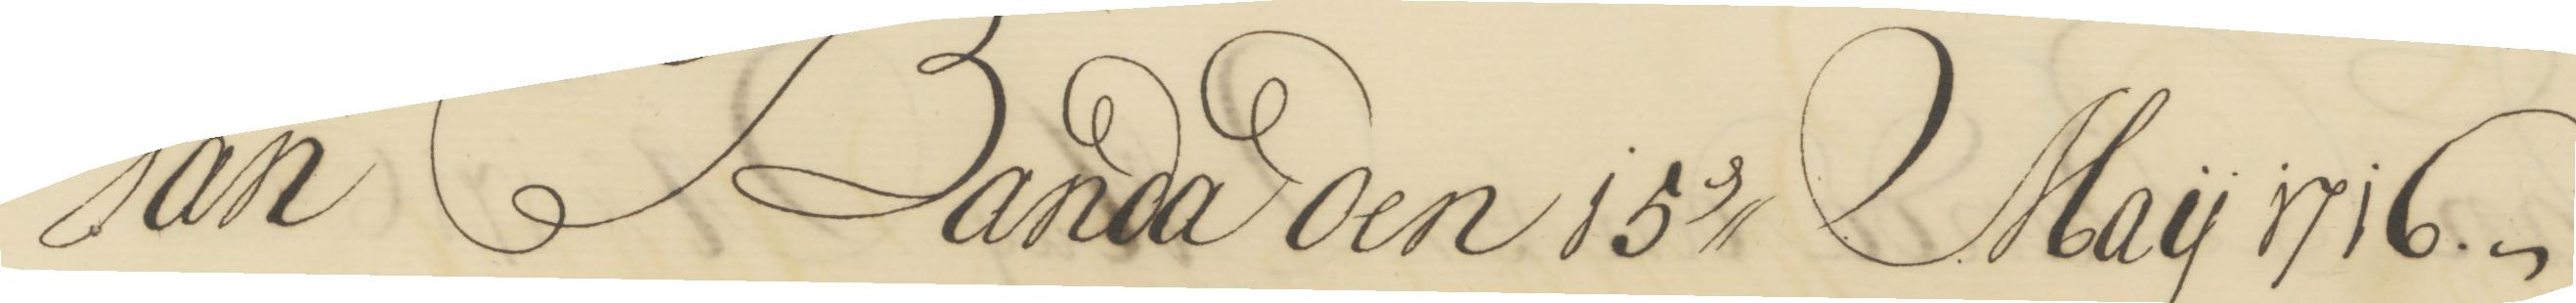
Van Banda den 15„en Maij 1716. –
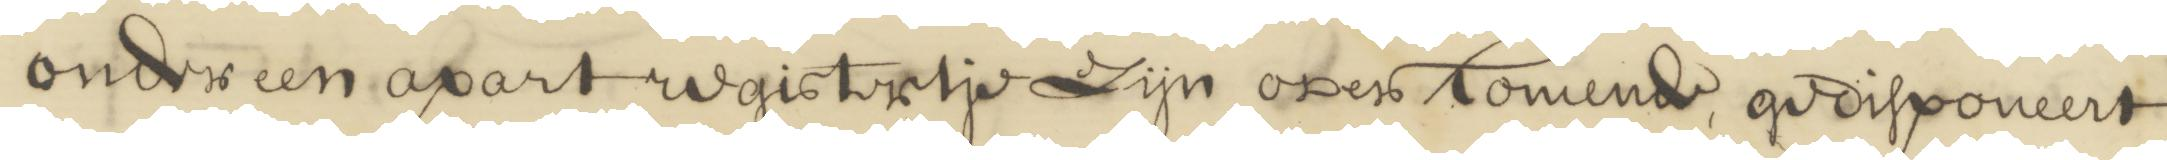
onder een apart registertje zijn overkomende, gedisponeert
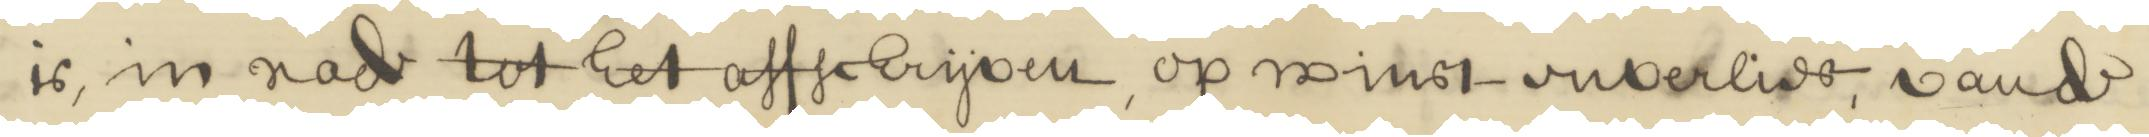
is, in rade tot het affschrijven, op winst en verlies, van de
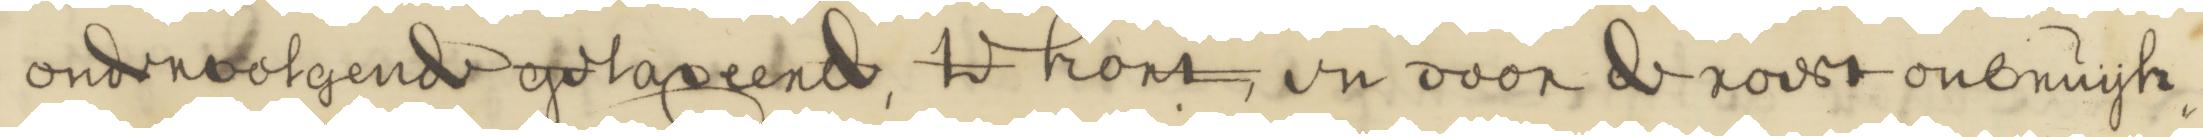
ondervolgende getaxeerde, te kort, en door de roest onbruijk
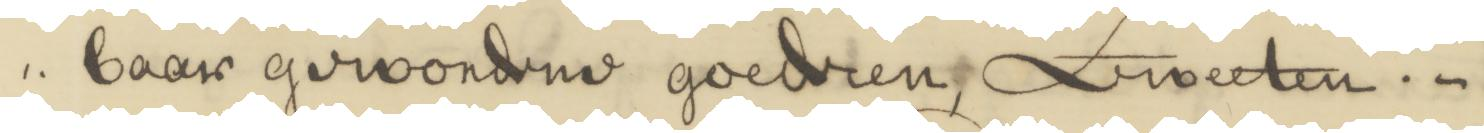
„baar gewordene goederen, teweeten. –
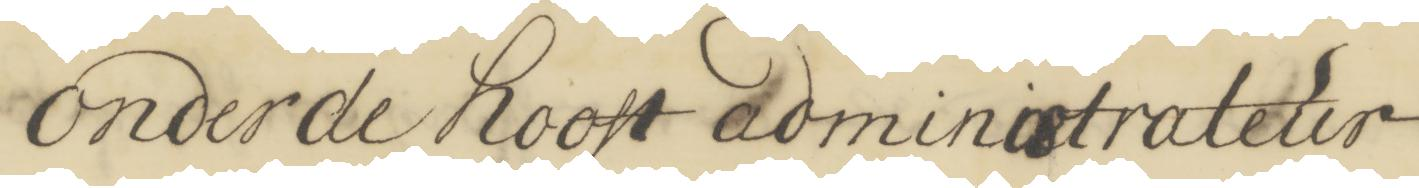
onder de hooft administrateur
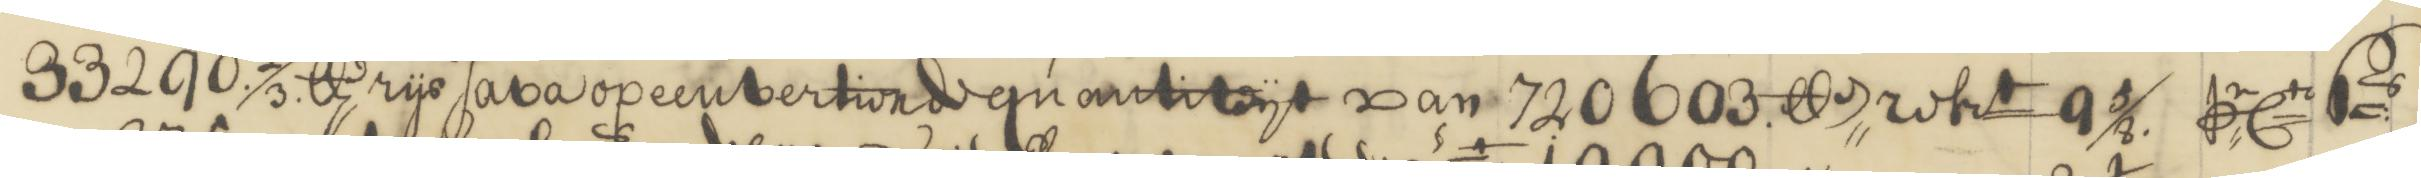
33240. 2/3. lb rijs Java op een vertier de quantiteijt van 720603. lben „ rek=t 4 5/8. p„r C=to P=s.
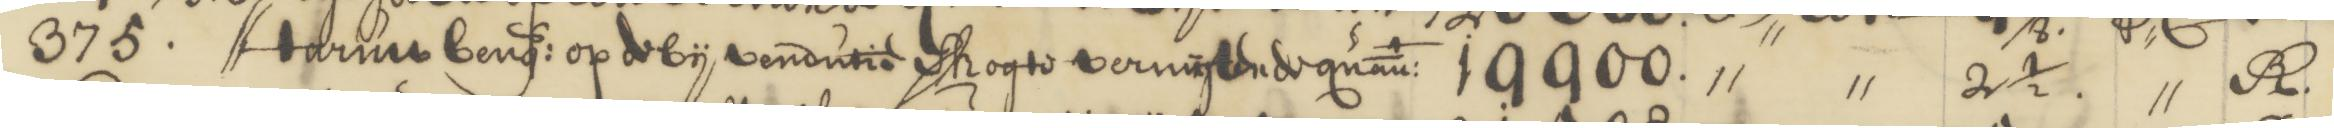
375. „ tarun beng:s op de bij vendutie verkogte vermijten de quan:t 14400. „ „ 2½. „ R.
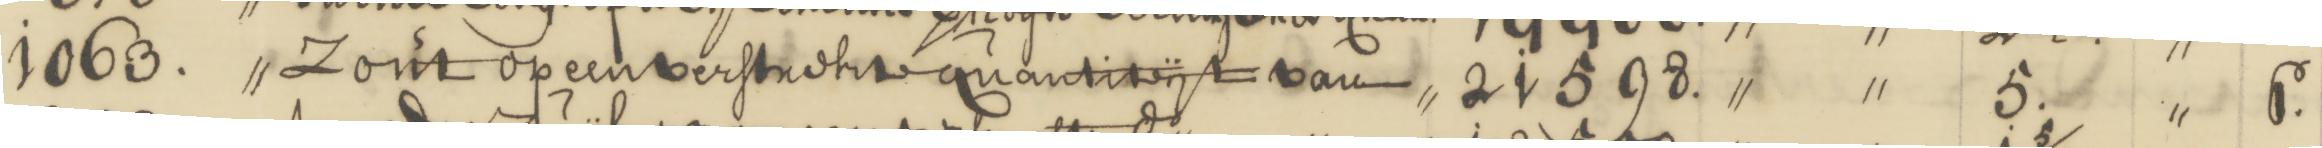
1063. „ zout op een verstrekte quantiteijt van „ 21598. „ „ 5. „ t.s
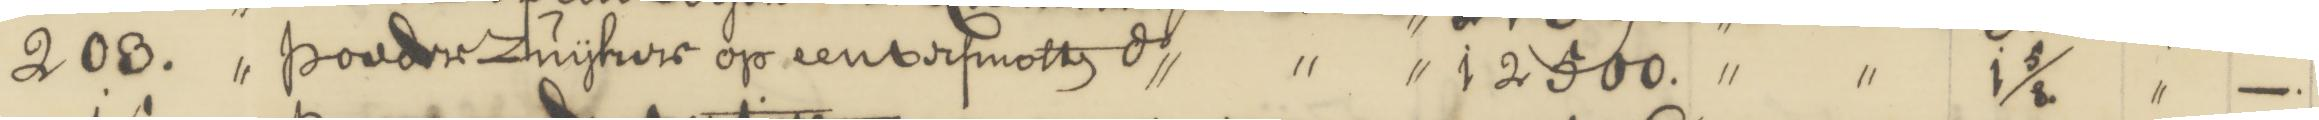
203. „ poederzuijker op een versmolten d„o „ „ 12500. „ „ 1 5/8. „ —.
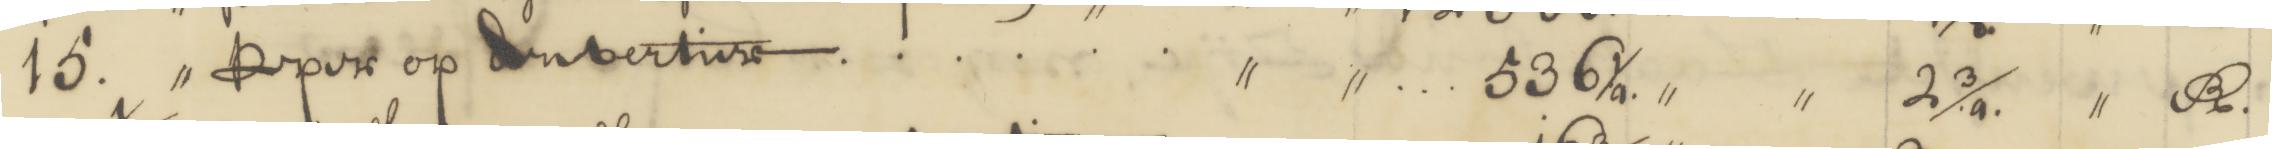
15. „ peper op den vertier . . . . . . „ „ . . . 53 6¼. „ „ 2¾. „ R.
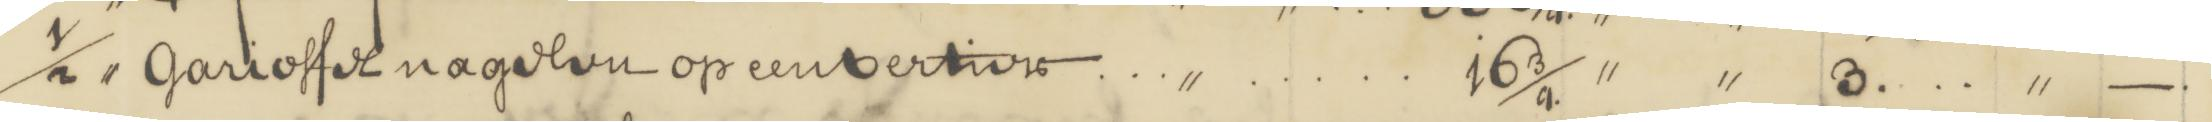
½ „ garioffel nagelen op een vertier . . . „ . . . . . 16¾ „ „ 3. . . . „ —.
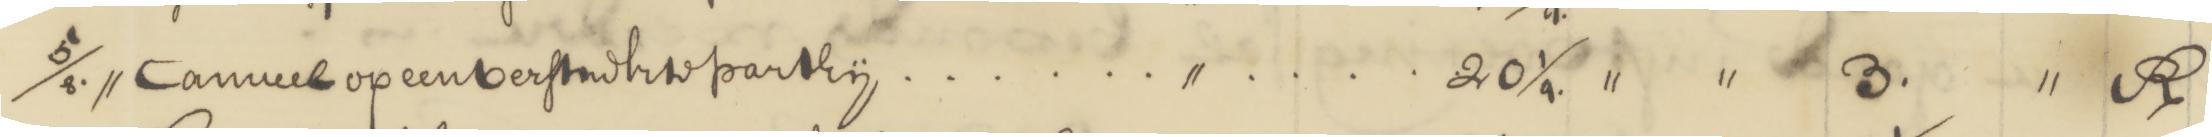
5/8. „ canneel op een verstrekte parthij . . . . . . „ . . . . 20¼. „ „ 3. „ R
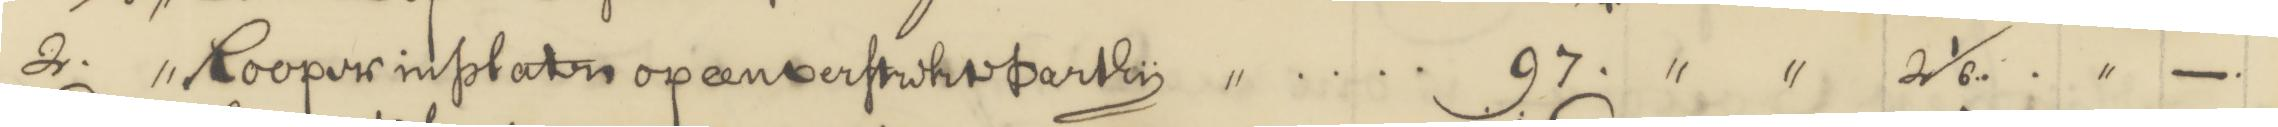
2. „ kooper in platen op een verstrekte parthij „ . . . . 97. „ „ 2 1/6. . „ —
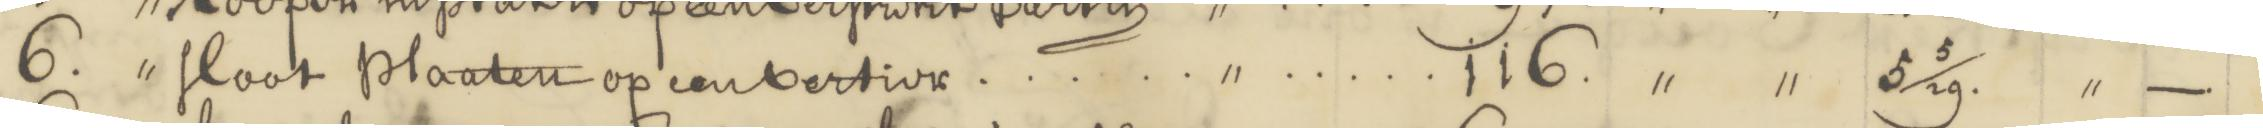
6. „ sloot plaaten op een vertier . . . . . „ . . . . . 116. „ „ 5 5/29. „ —
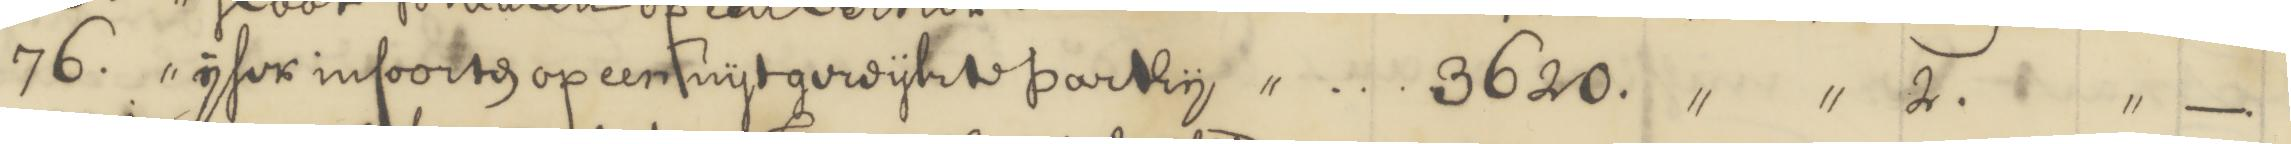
76. „ ijser insoorten op een uijt gereijkte parthij „ . . . 3620. „ „ 2. „ —.
